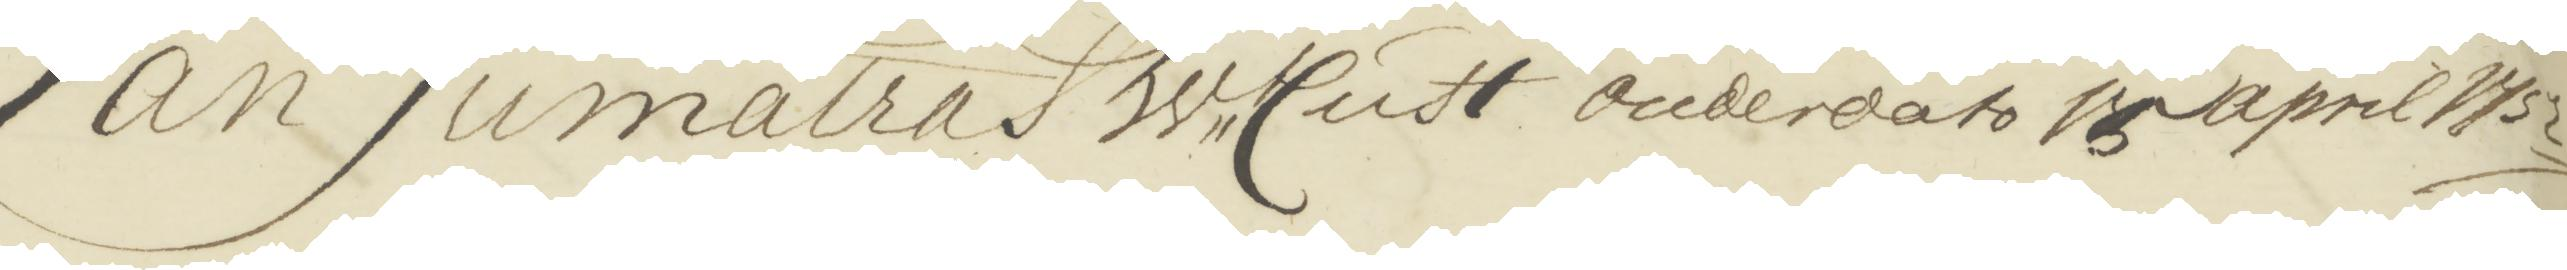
Van Sumatras w„tCust onderdato 15 april 1752
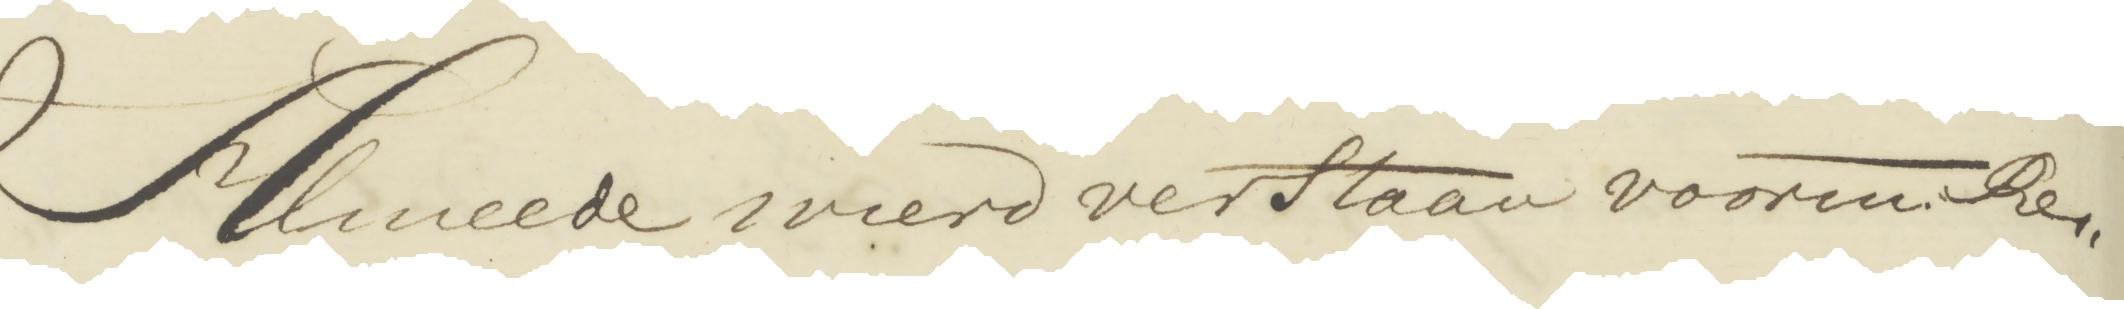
Almeede wierd verstaan voorm. Re„
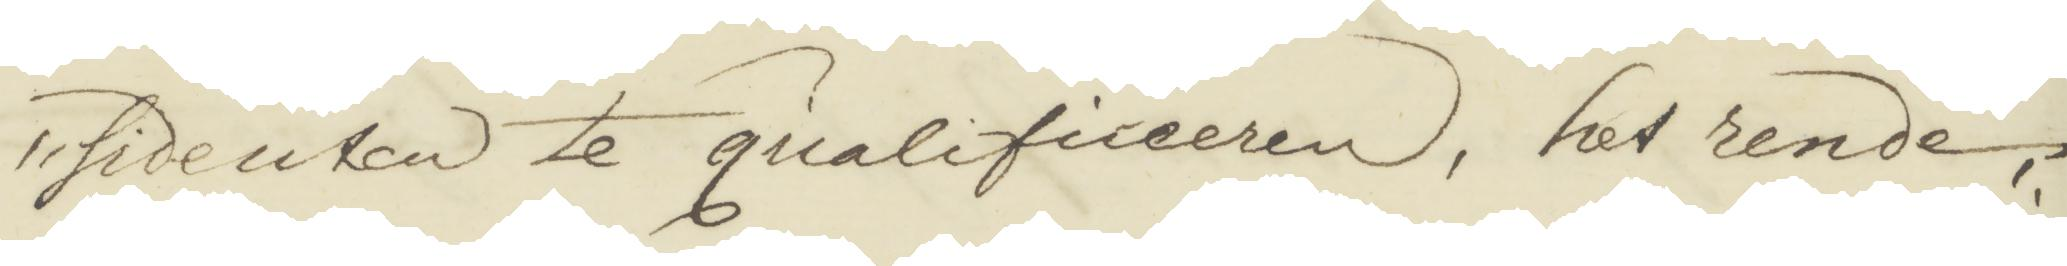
„sidenten te qualificeeren, het rende„
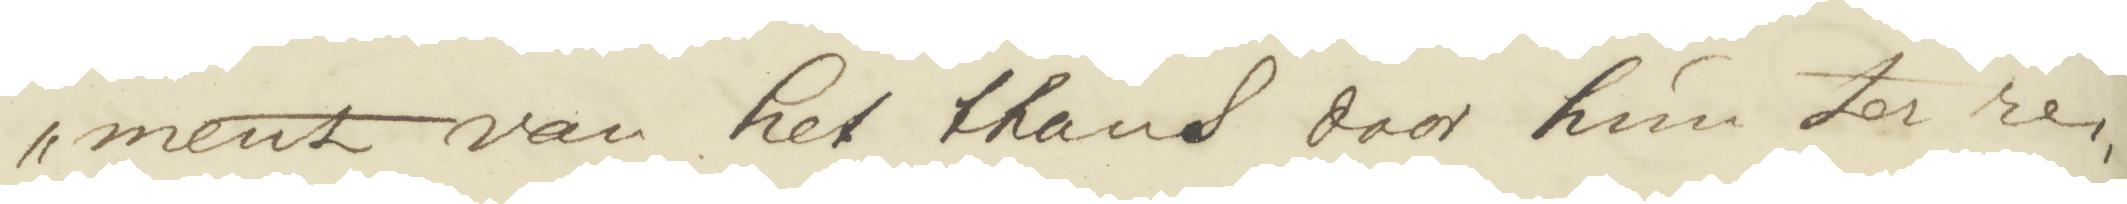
„ment van het thans door hun ter re„
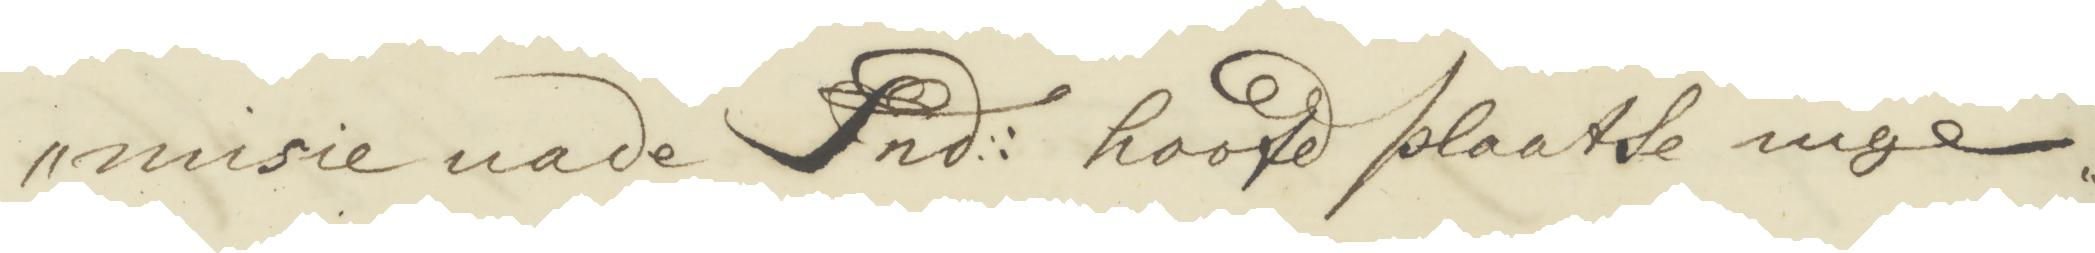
„misie nade Ind:: hoofd plaatse inge„
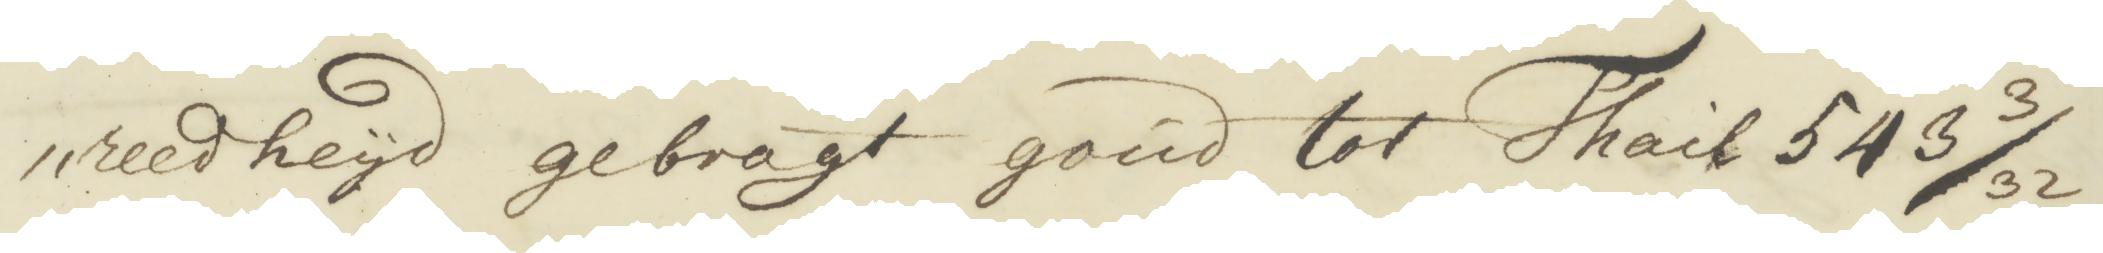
„reedheijd gebragt goud tot Thail 543 3/32
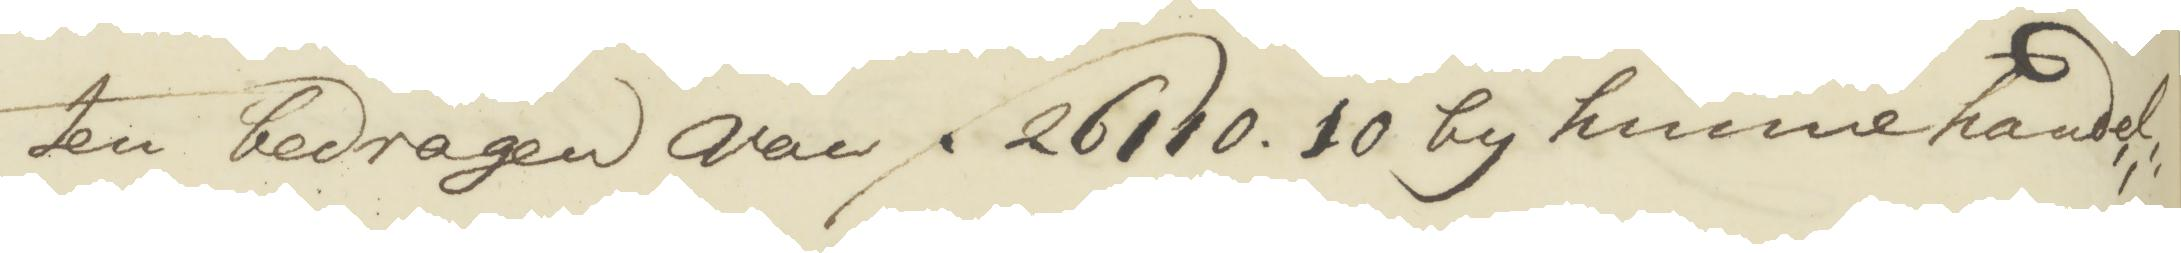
ten bedragen van ƒ26110. 10 by hunne handel„
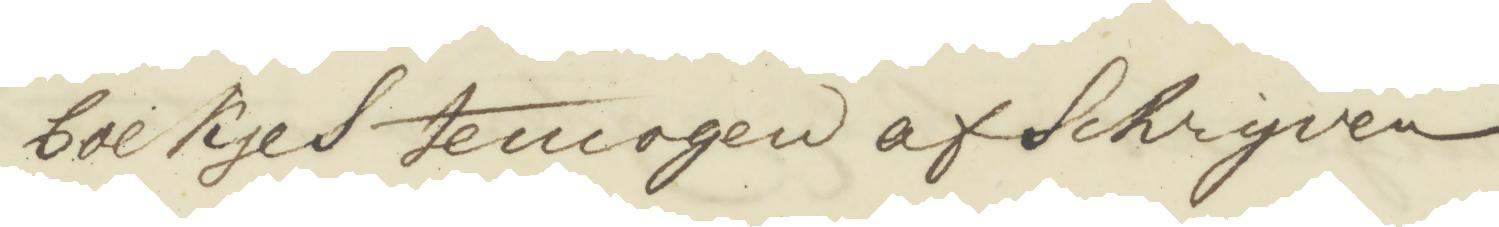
boekjes temogen afschrijven
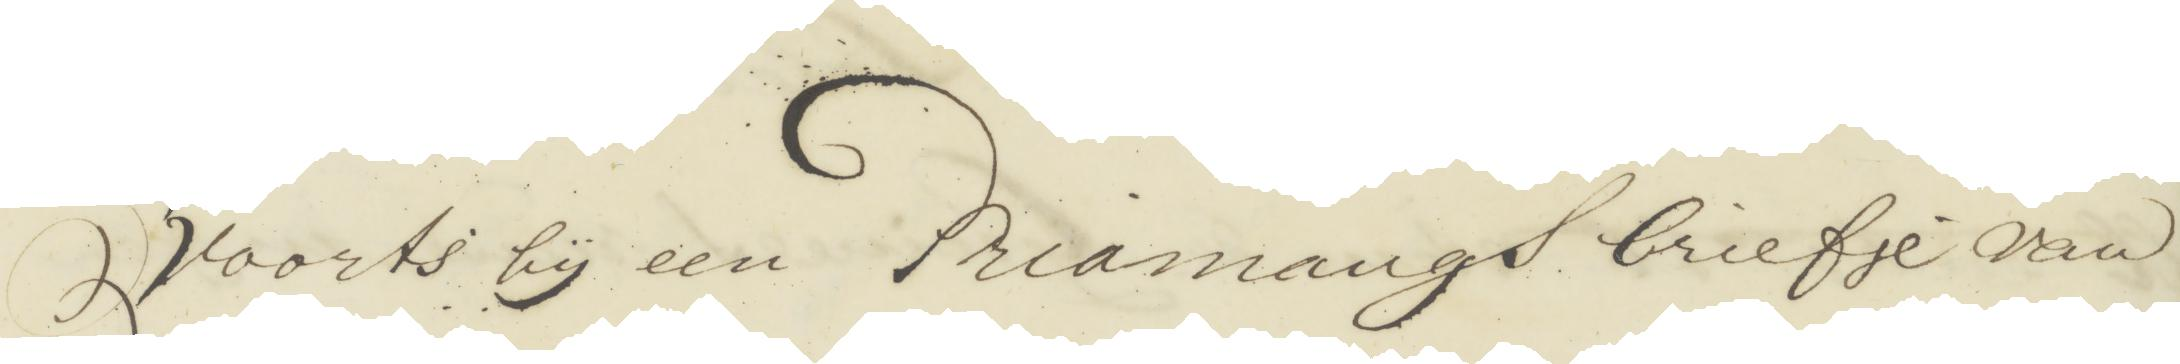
Voorts bij een Priamangs briefje van
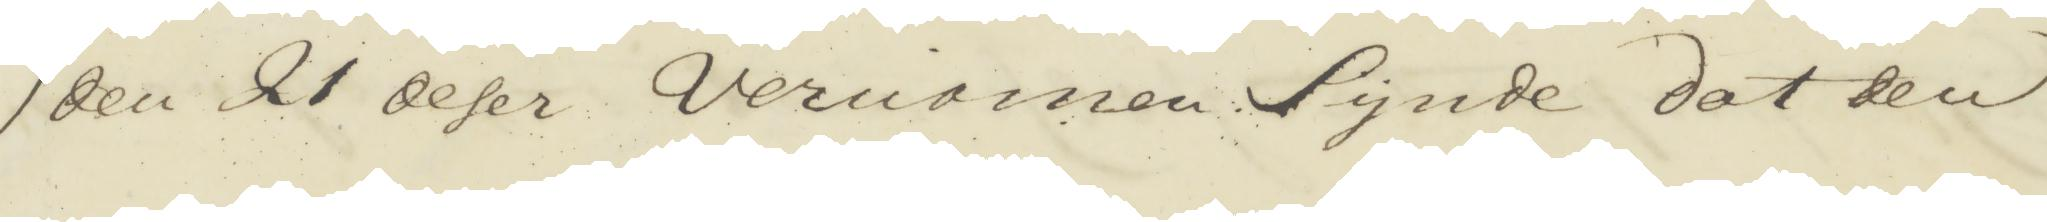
den 21 deser vernomen Sijnde dat den
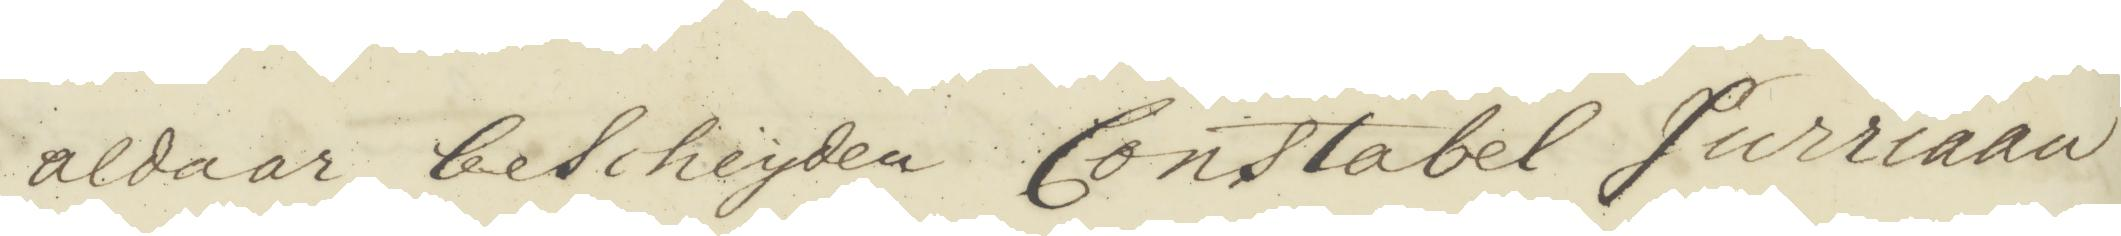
aldaar bescheijden Constabel Jurriaan
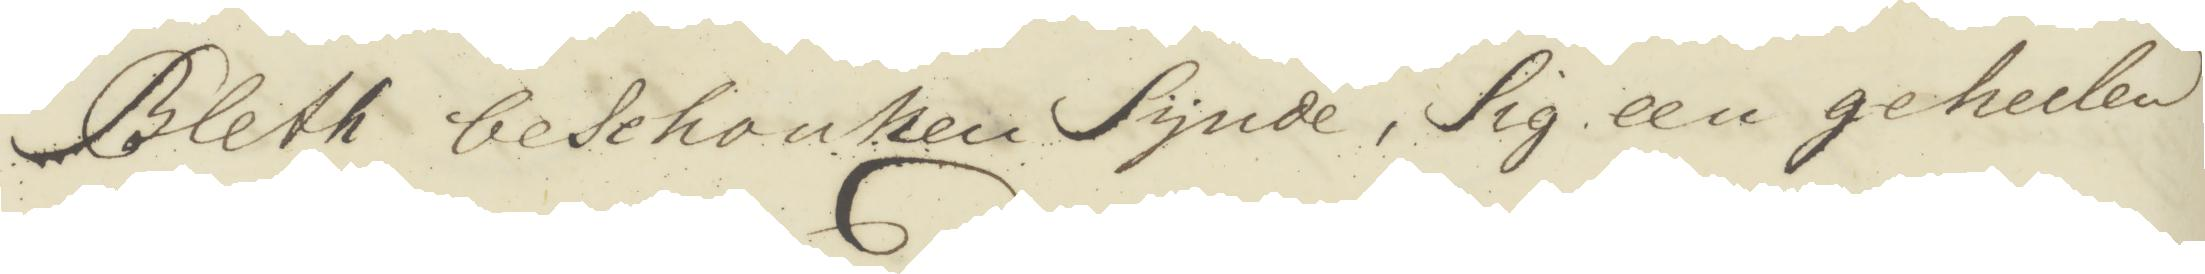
Bleth beschonken sijnde, Sig een geheelen
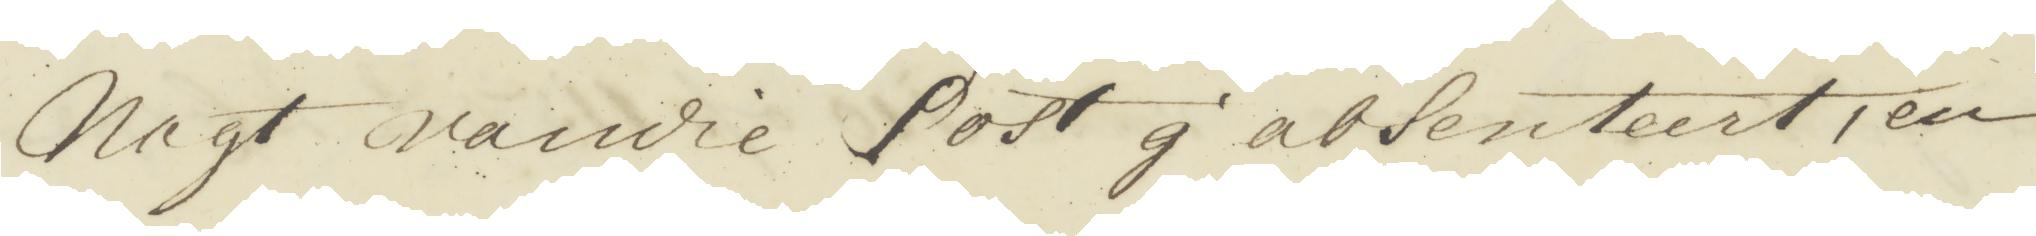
nagt vandie Post g’ absenteert, en
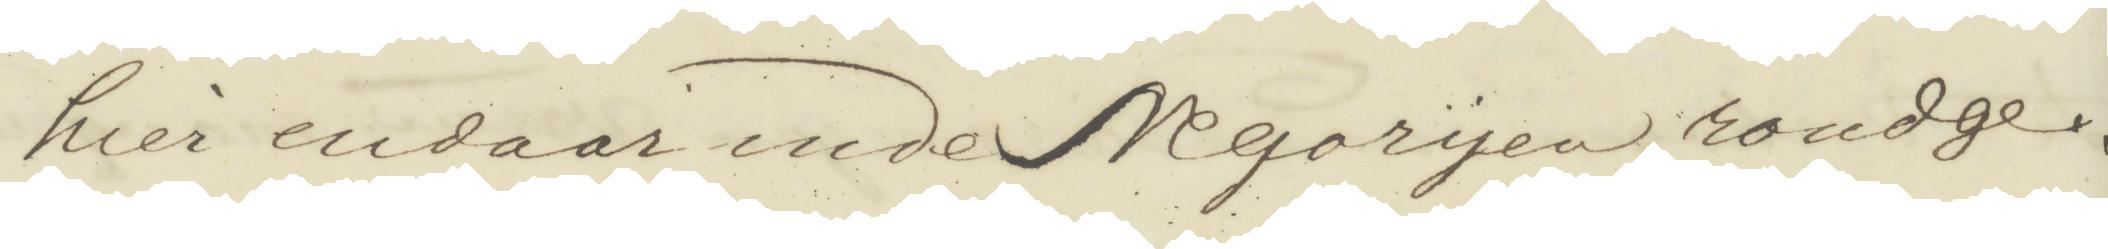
hier en daar inde Negorijen rondge:
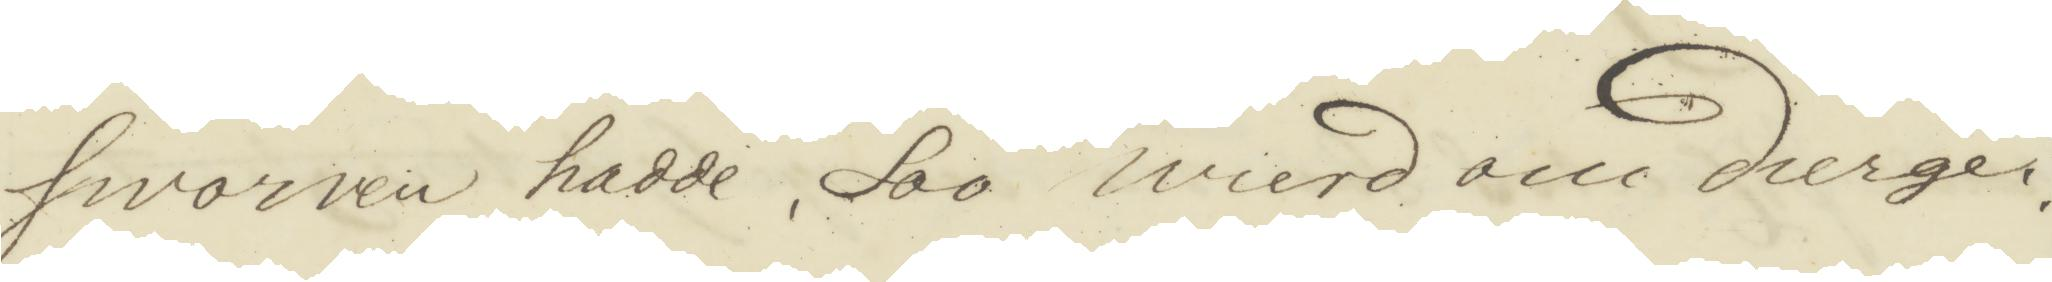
sworven hadde, Soo wierd om dierge:
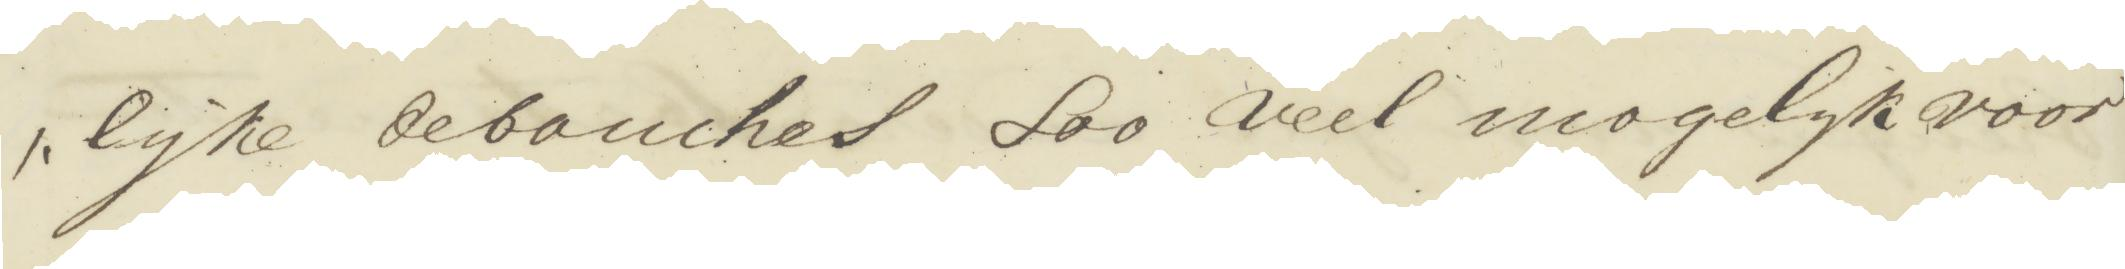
„ lijke debouches Soo veel mogelyk voor
